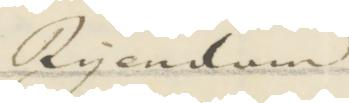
Rijendam
